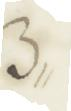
3„
